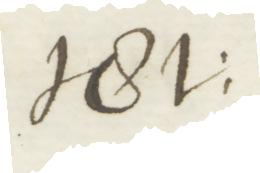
181:
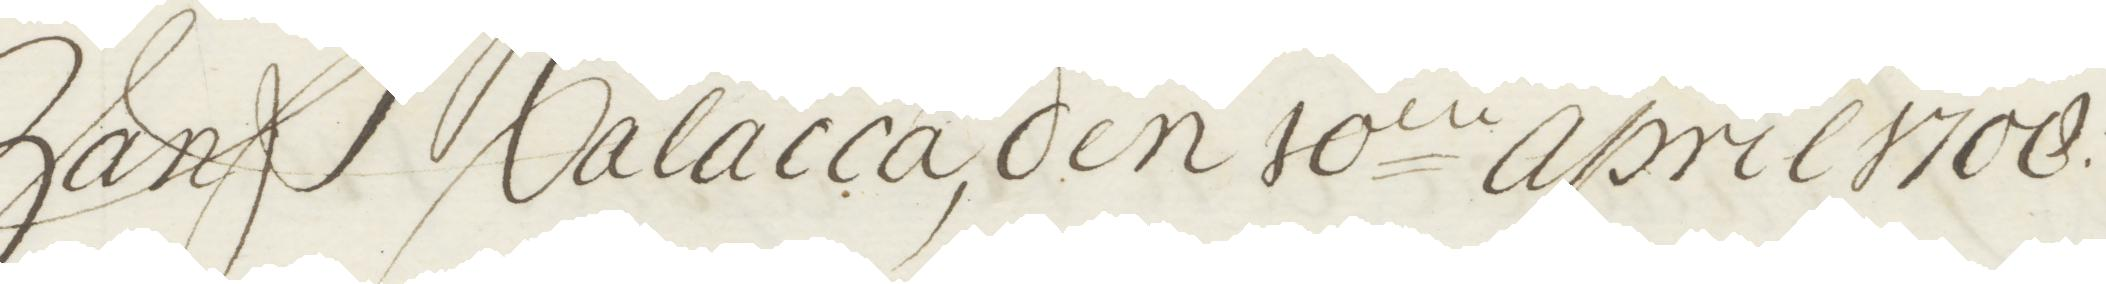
Van Malacca, den 10=en april 1708.
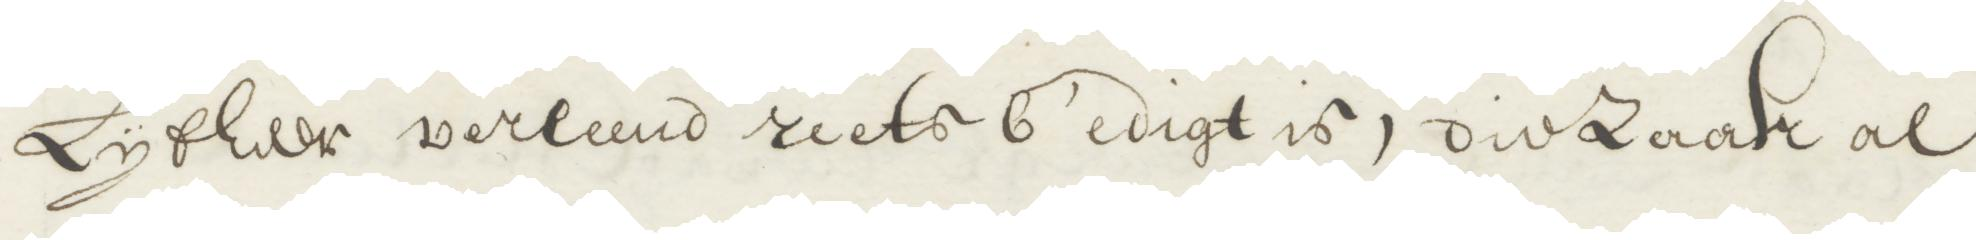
Lijfheer verleend reets b'edigt is, die zaak al
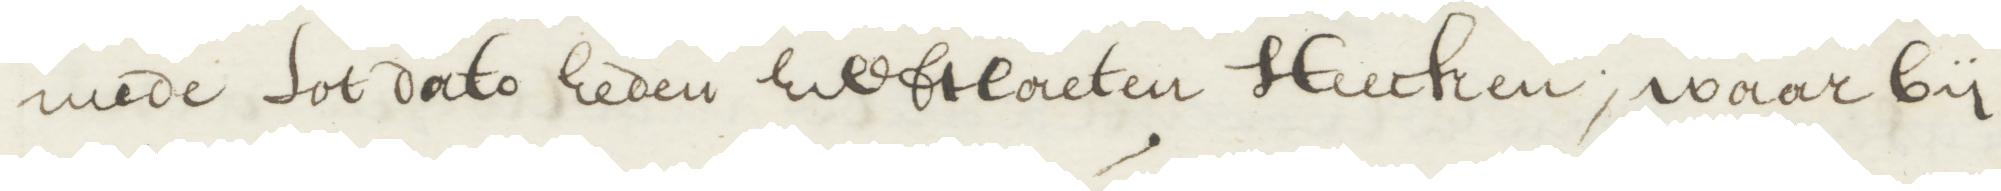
mede tot dato heden heeft laeten steecken; waar bij
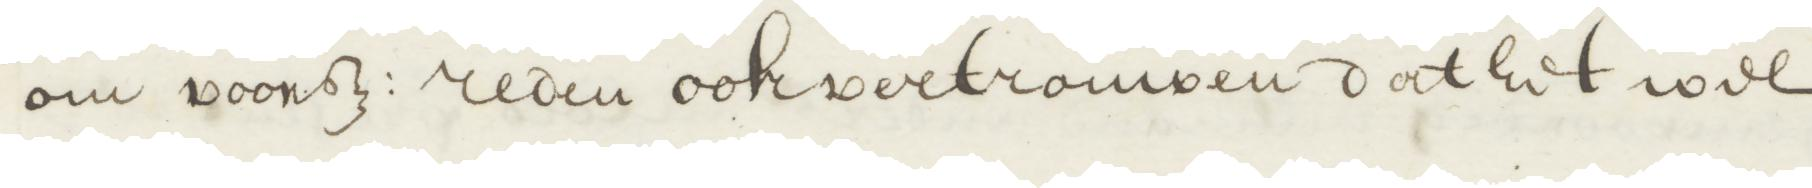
om voorsz: reden ook vertrouwen dat het wel
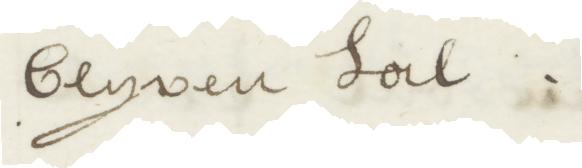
blyven sal.
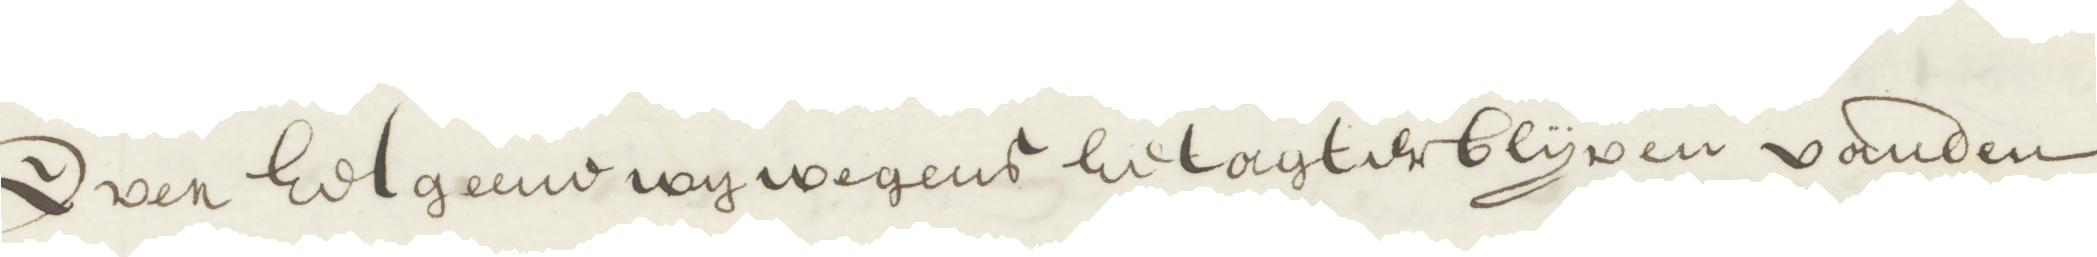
Over het geene wy wegens het agterblijven vanden
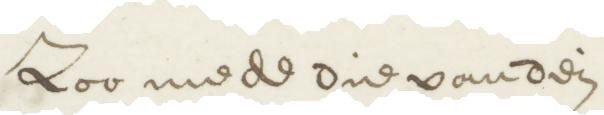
zoo mede die van den
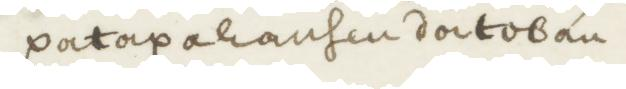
patapahansen datoban
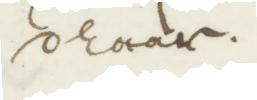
dhaar.
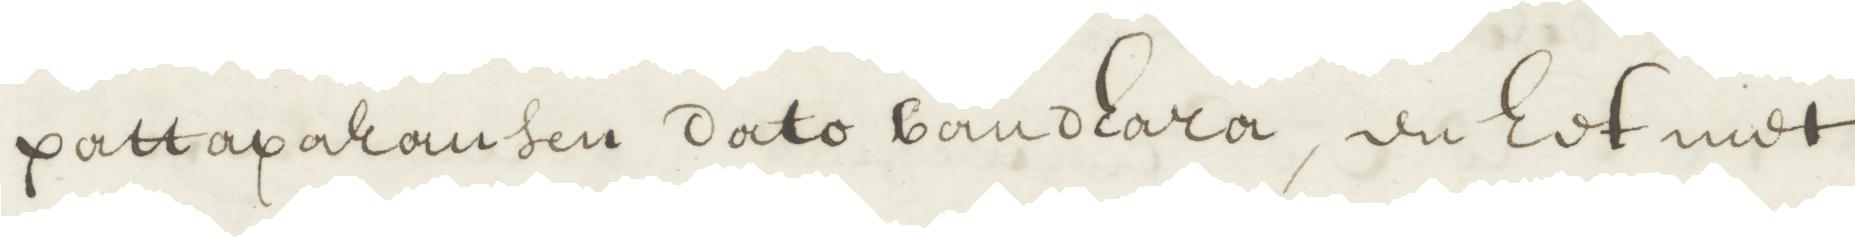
pattapahansen dato bandhara, en het niet
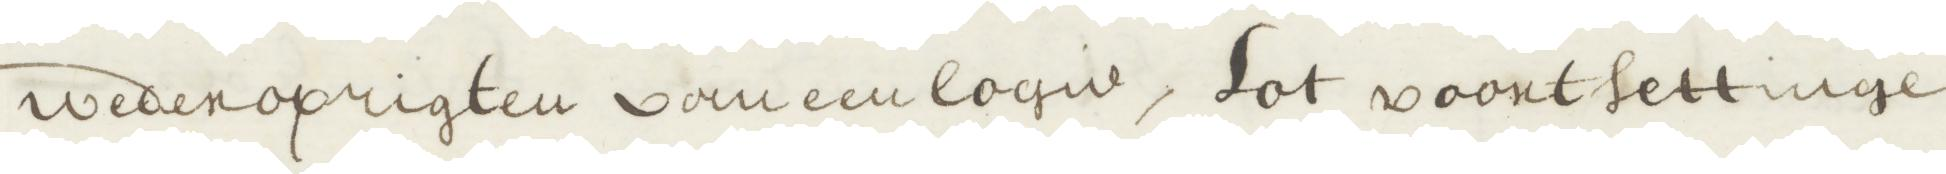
wederoprigten van een logie, tot voortsettinge
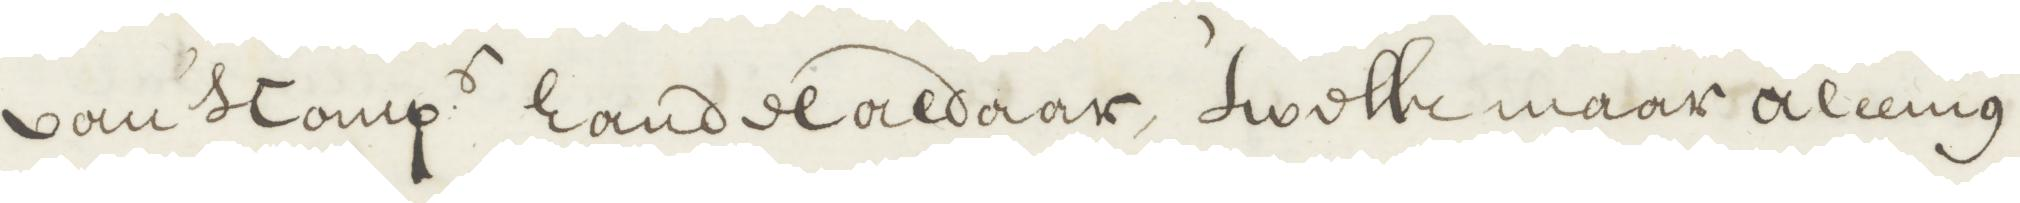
van ’s Comp.s handel aldaar, 'twelk maar aleenig
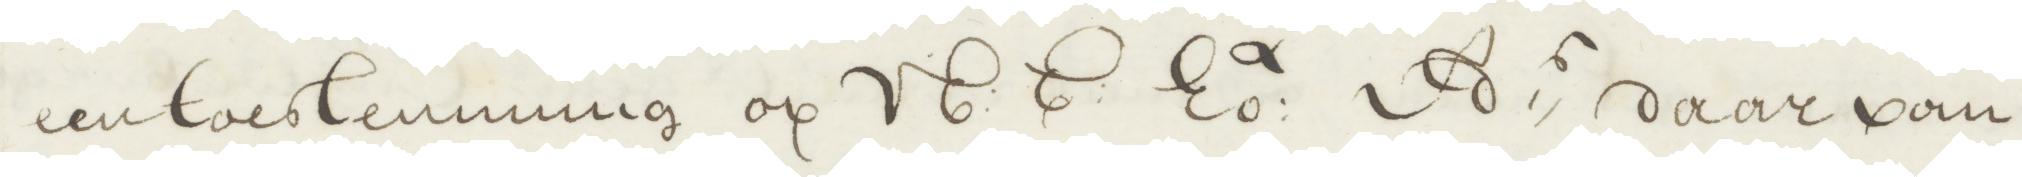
een toestenming op UE: E: ho: Ed„s daar van
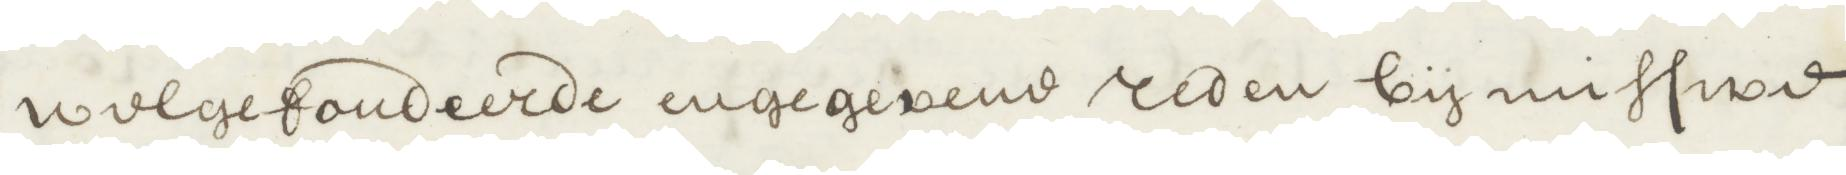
welgefondeerde en gegevene reden bij missive
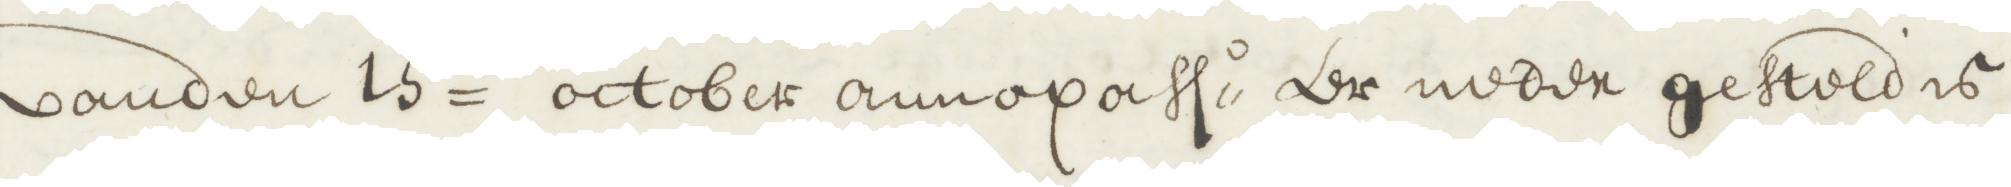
van den 15=en october annopass„o ter neder gesteld is
